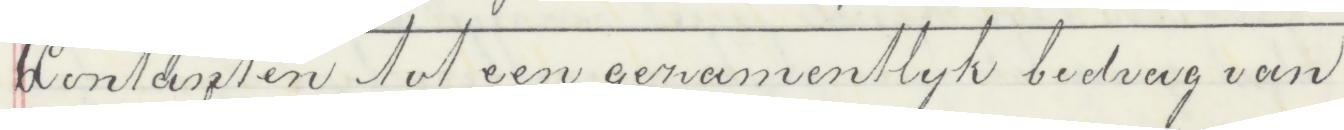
6 Contanten tot een gezamentlyk bedrag van
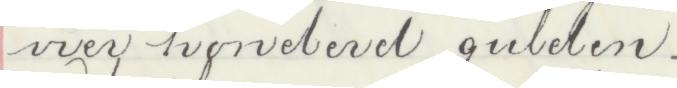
vier honderd gulden
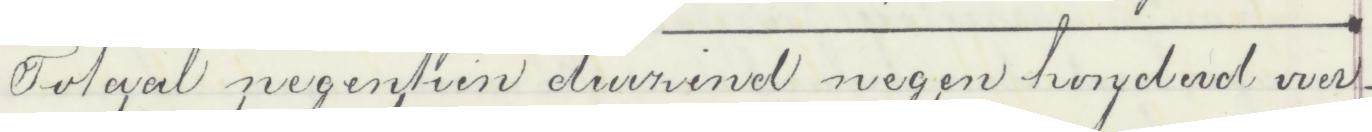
Totaal negentien duizend negen honderd vier
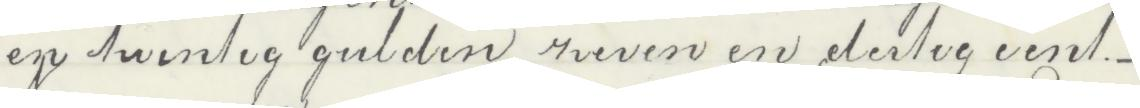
en twintig gulden zeven en dertig cent.
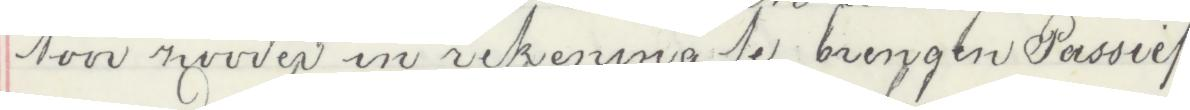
Voor zoover in rekening te brengen Passief
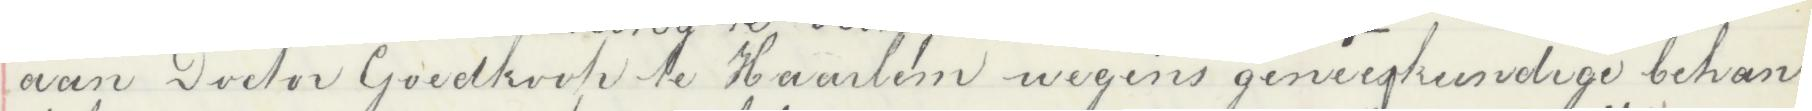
aan Doctor Goedkoop te Haarlem wegens geneeskundige behan
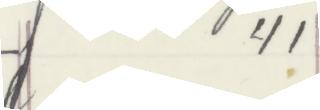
ƒ 41
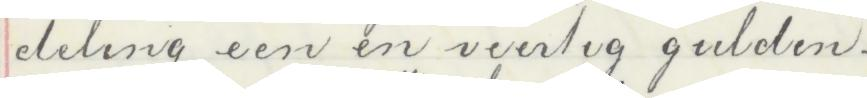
deling een en veertig gulden
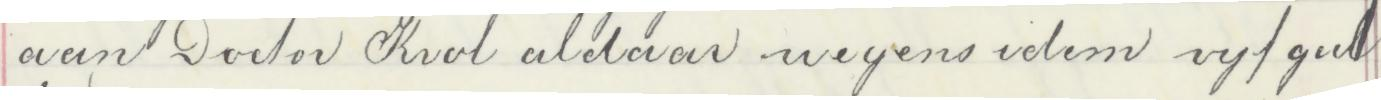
aan Doctor Krol aldaar wegens idem vyf gul
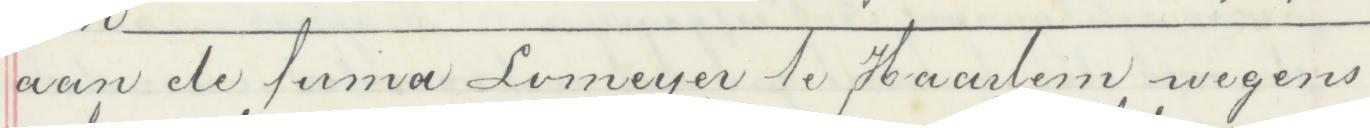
aan de firma Lomeyer te Haalem wegens
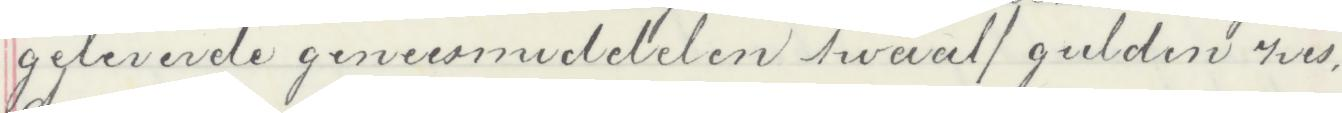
geleverde geneesmiddelen twaalf gulden zes
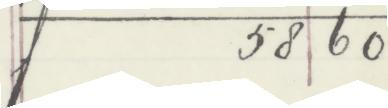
ƒ 58 60
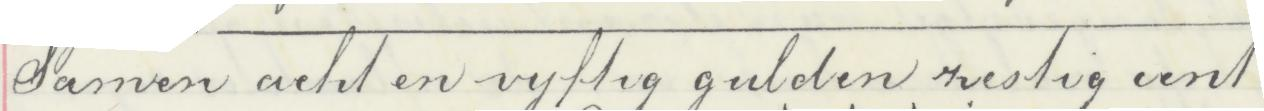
Samen acht en vyftig gulden zestig cent
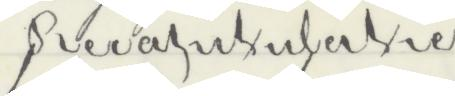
recaputulatie
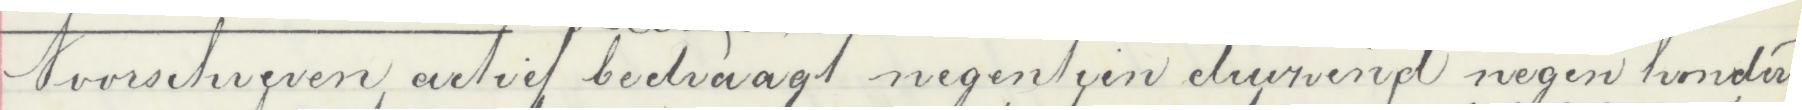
Voorschreven acties bedraagt negentien duizend negen honderd
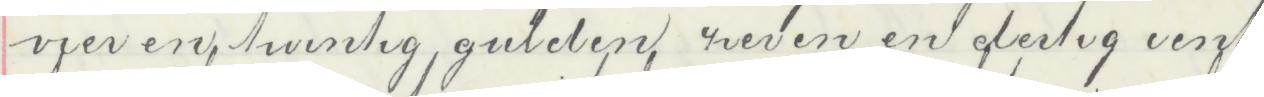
vier en twintig gulden zeven en dertig cent
